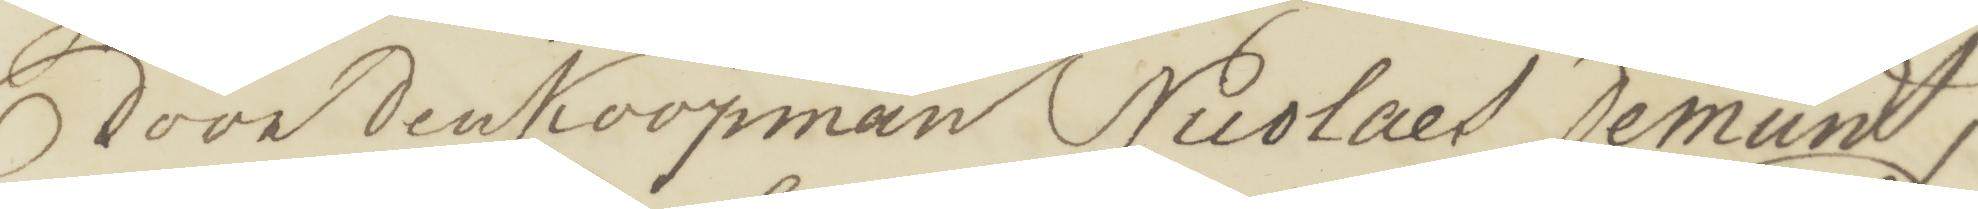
door den koopman Nicolaes demunt,
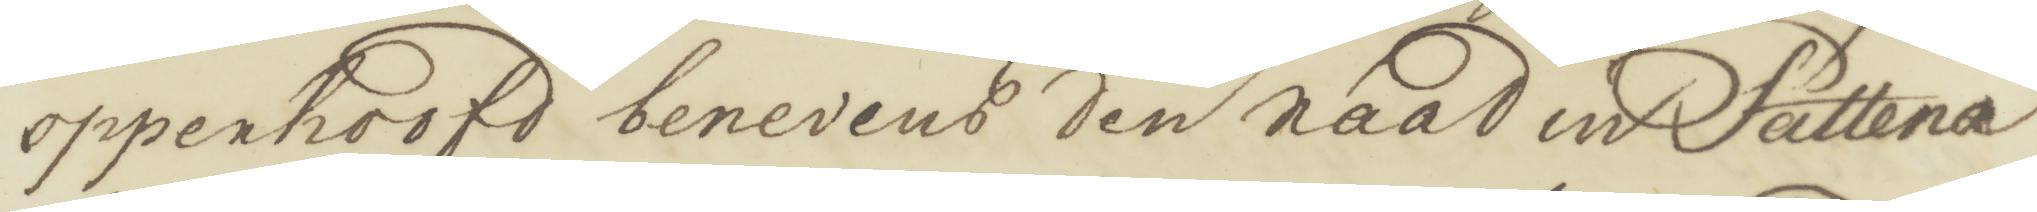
opperhoofd benevens den raad in Pattena
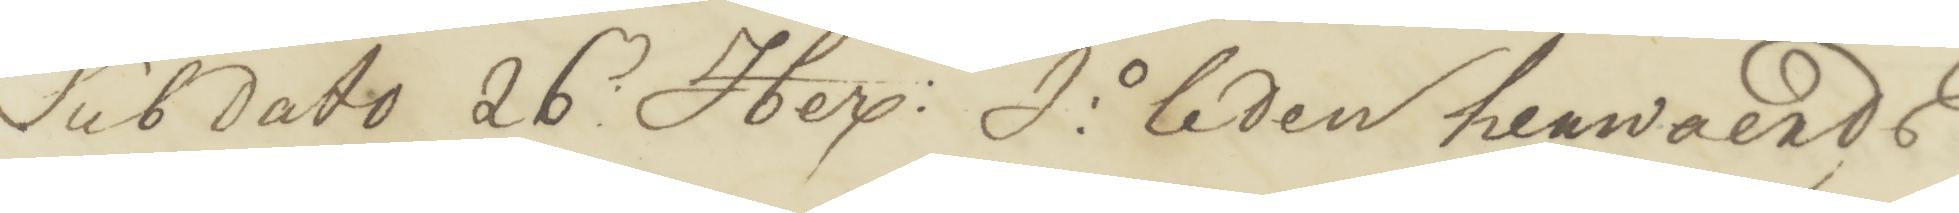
sub dato 26:' 7ber: I:o leden herwaerds
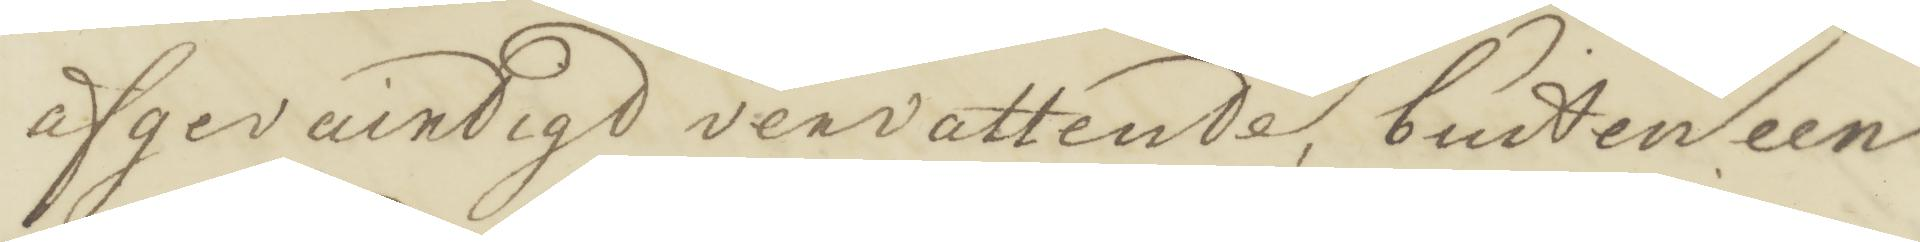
afgevairdigd vervattende, buiten een
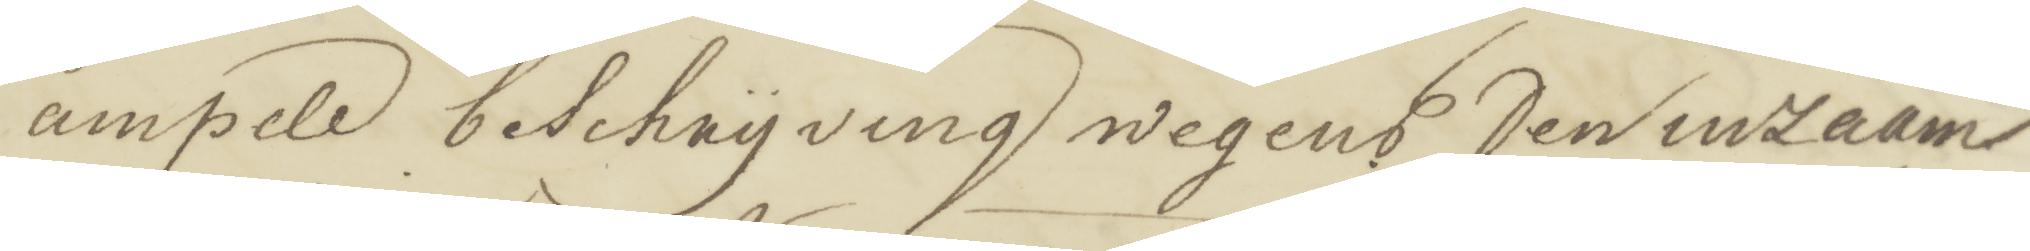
ampele beschrijving wegens den inzaam
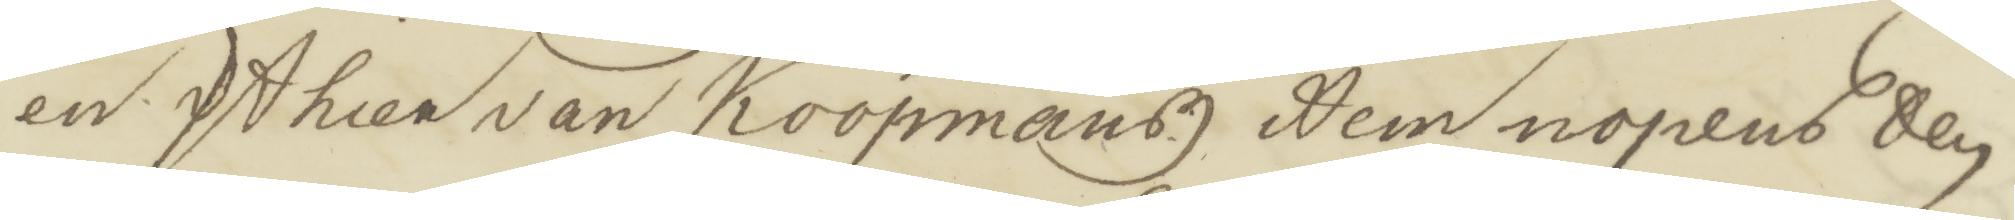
en verthier van Koopmans Item nopens den
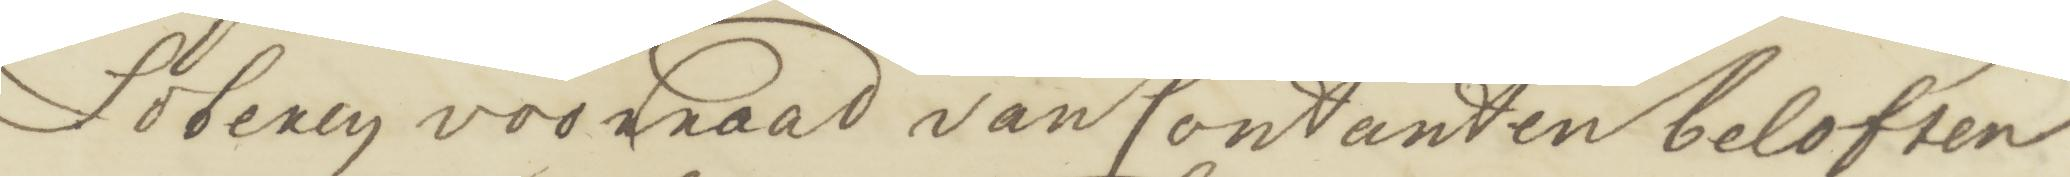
Soberen voorraad van Contanten beloften
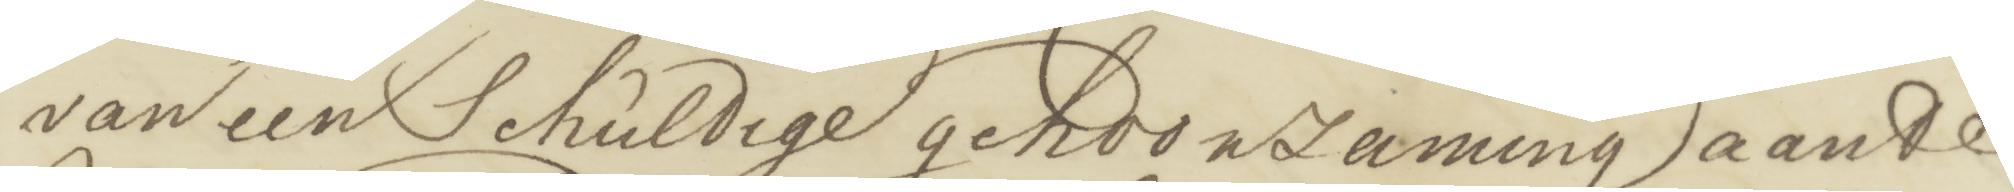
van een Schuldige gehoorzaming aan de
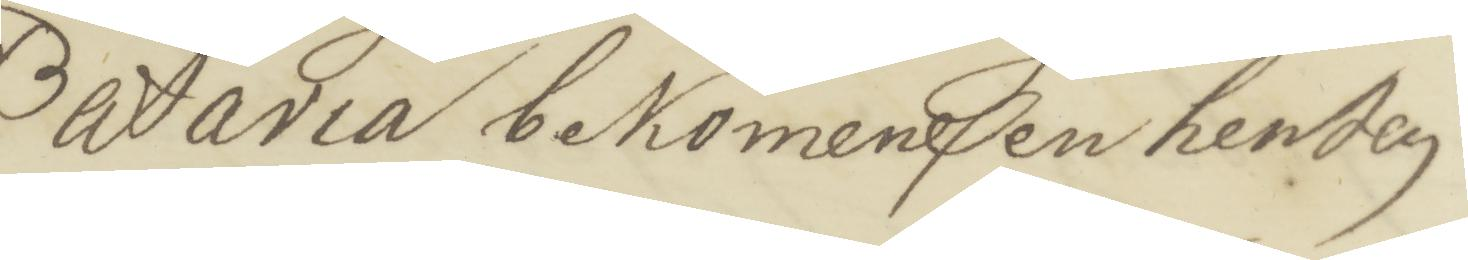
I:o van Batavia bekomene en herten
